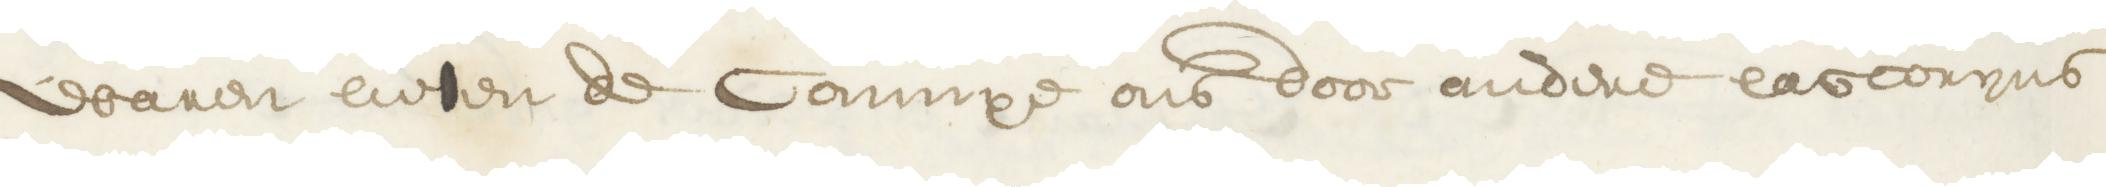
waren lieten de coninxe ons door andere lascorijns
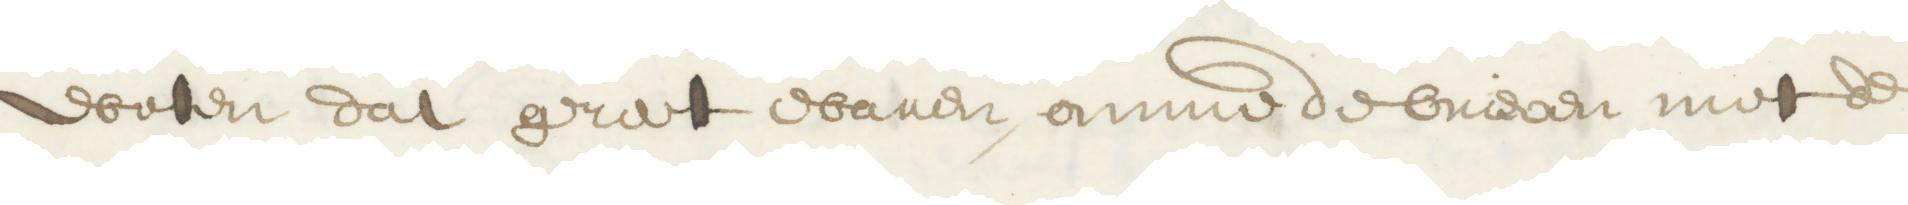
weten dat gereet waren, omme de brieven met de
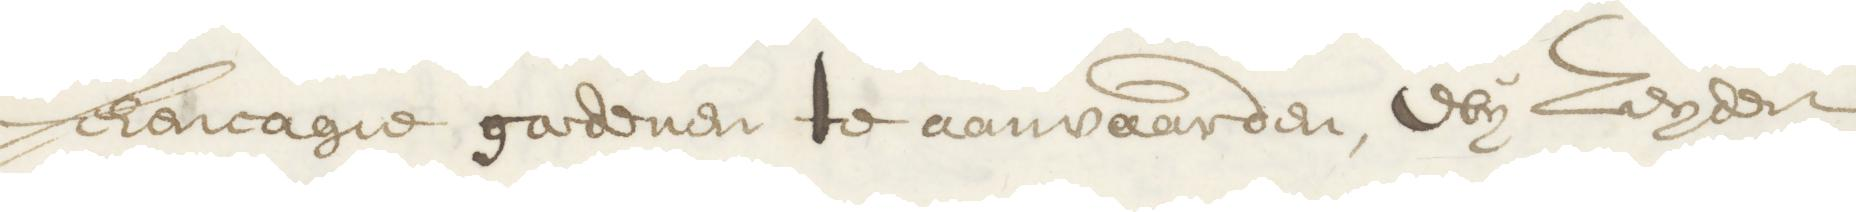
schencagie goederen te aanvaarden, wij zeijden
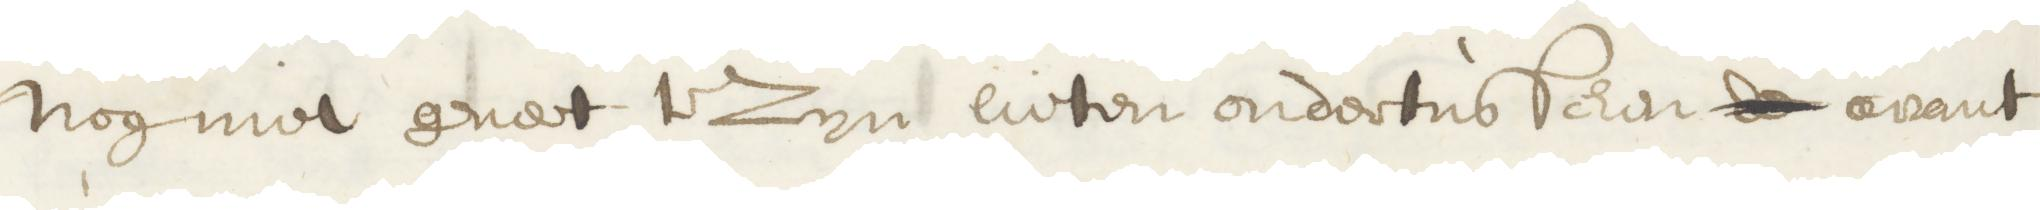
nog niet gereet te zijn lieten ondertusschen avant
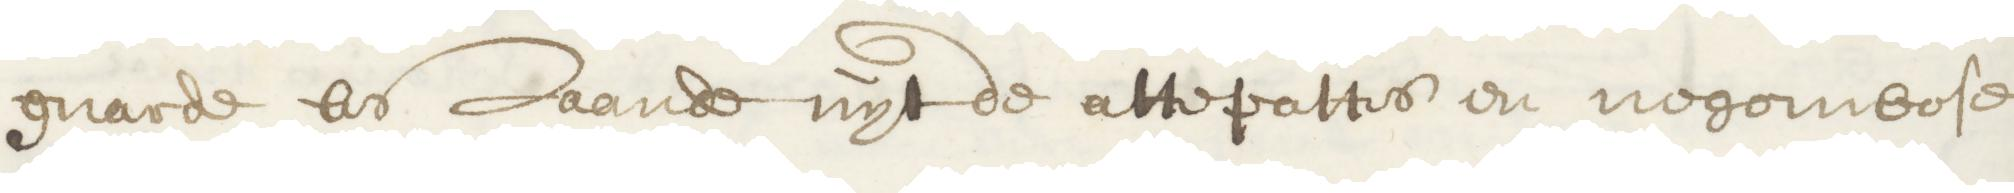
guarde bestaande uijt de attepattes en negombose
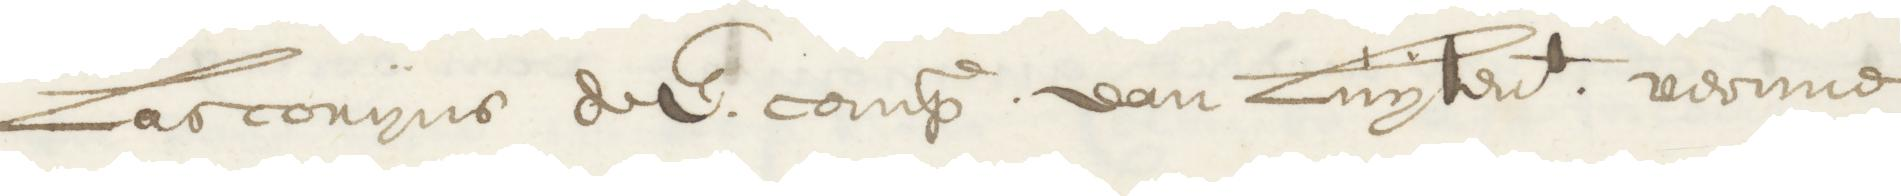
lascorijns deE. comp. van Luijten.t vermue
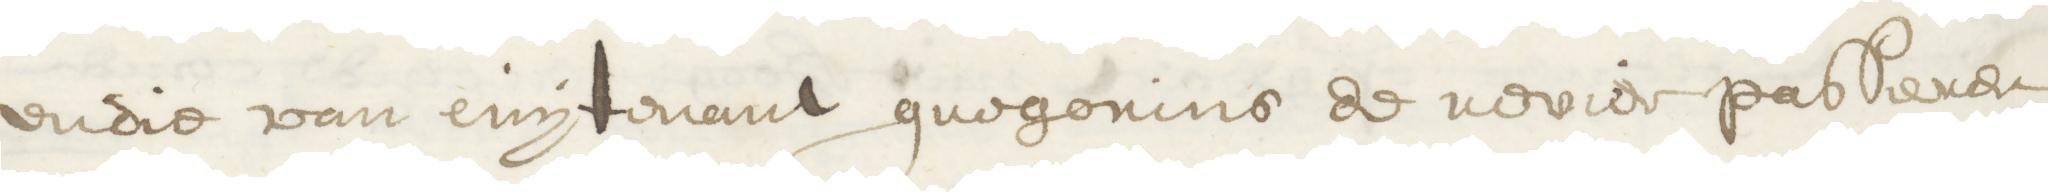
en die van luijtenant gregorius de revier passeren
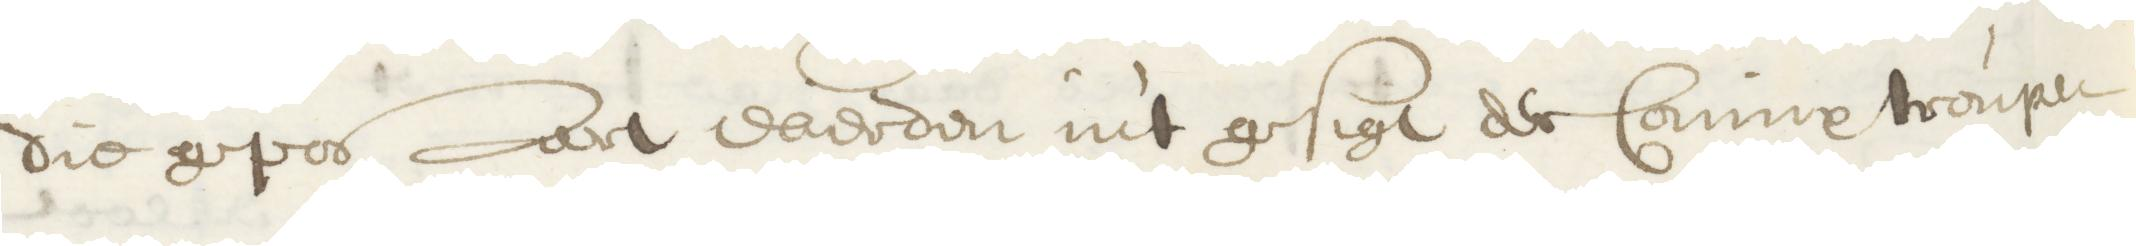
die geposteert werden in’t gesigt der Coninx troupen
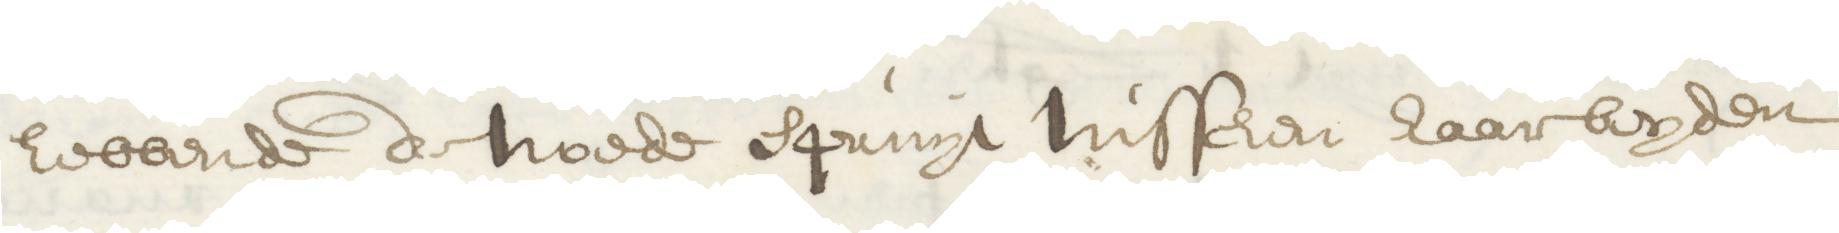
hebbende de twede spruijt tusschen haar beijden
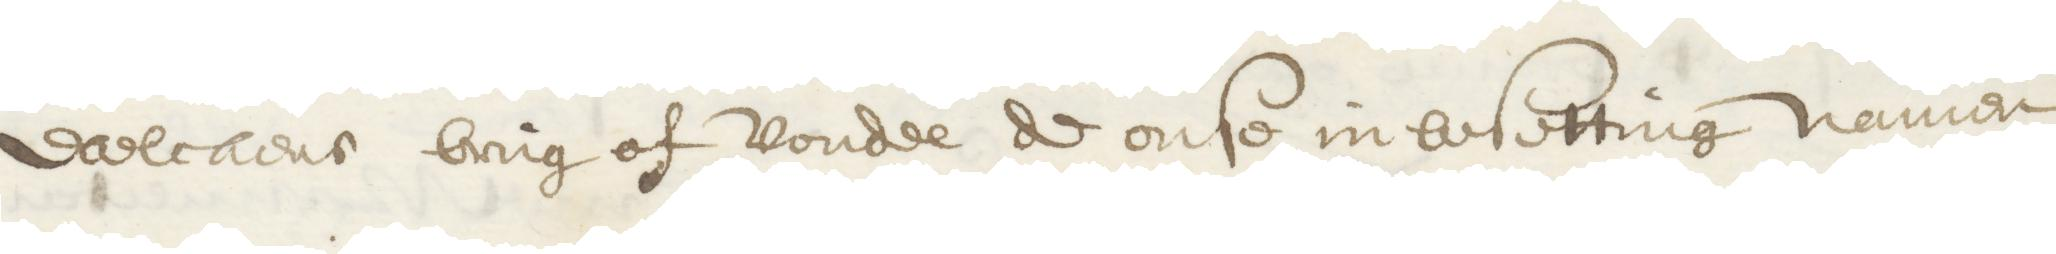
welckers brug of vondel de onse in besetting namen
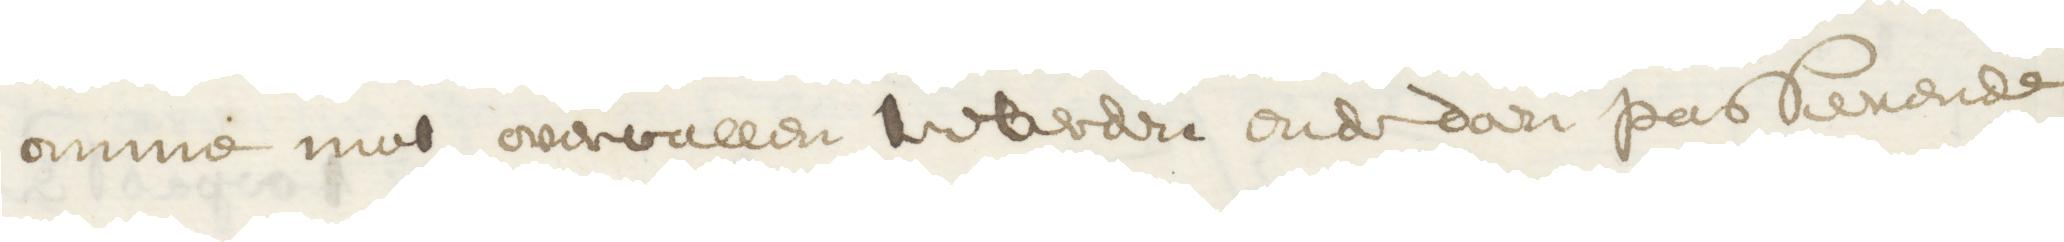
omme niet overvallen tewerden ende doen passeerende
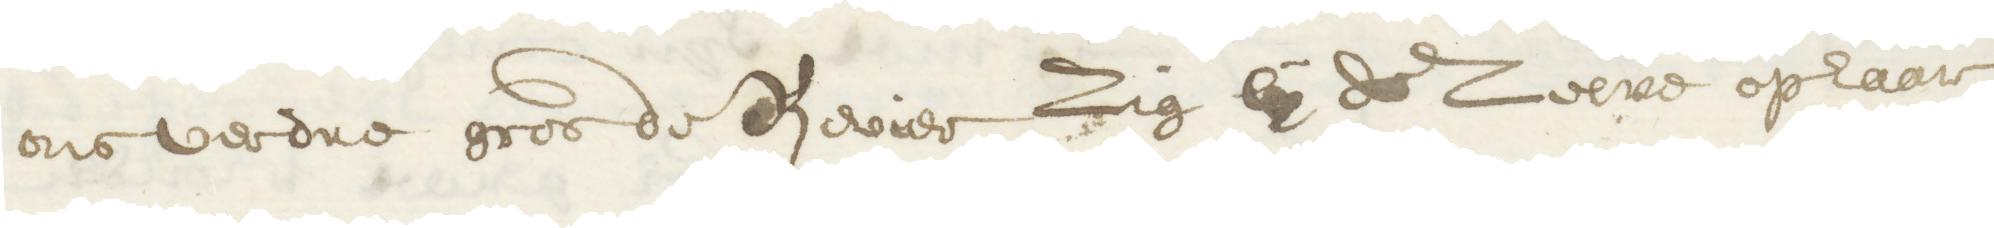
ons verdre grosde Revier zig bij dezelve op haar
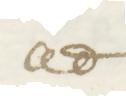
ad
